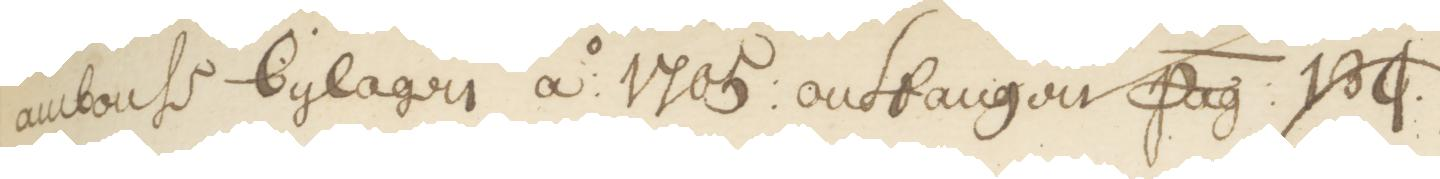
ambonse bijlagen, a:o 1705: ontfangen pag: 134.
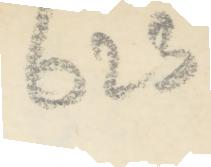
623
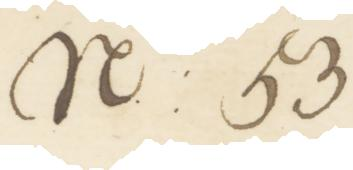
N:o 53
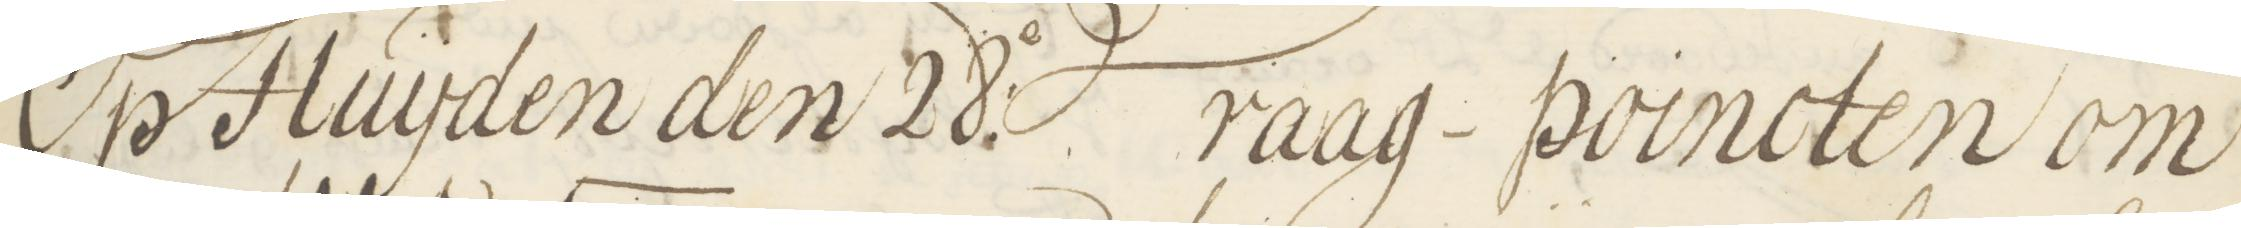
Op Huijden den 28:e Vraag-poincten om
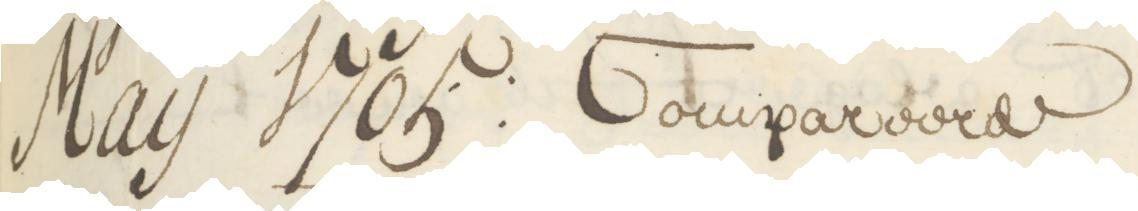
Maij 1705: Compareerde daar op ingevolge het
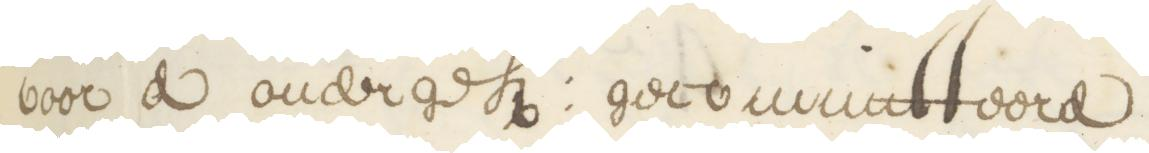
voor de ondergesz: gecommitteerd
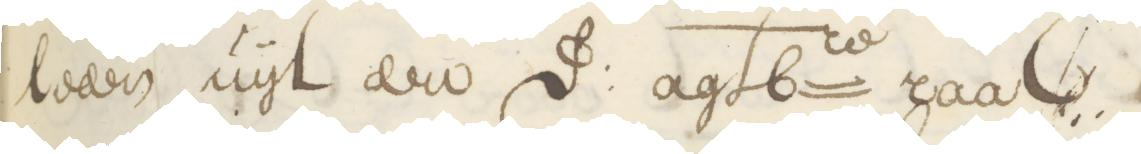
leden uijt den E: agtb=re raat
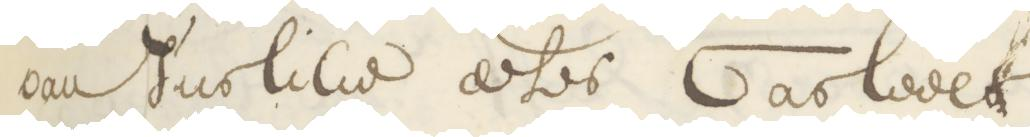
van Justitie deses Casteels
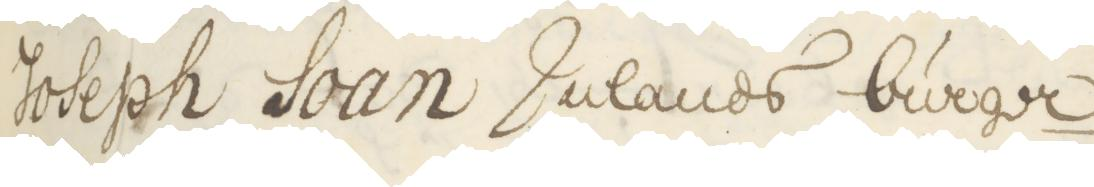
Joseph Soan Inlands burger
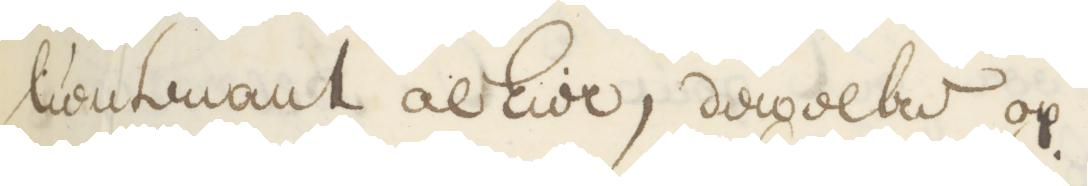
lieutenant alhier, dewelke op.
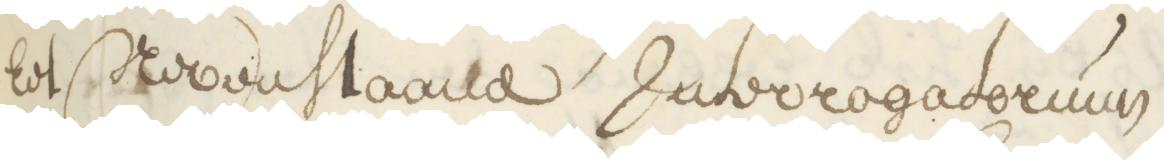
het Nevenstaande interrogatorium
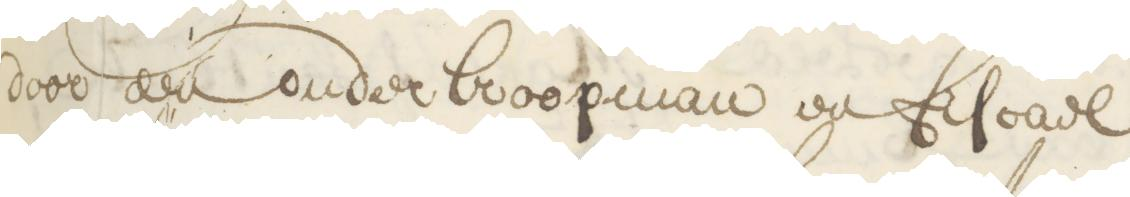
door en onderkoopman en fiscael
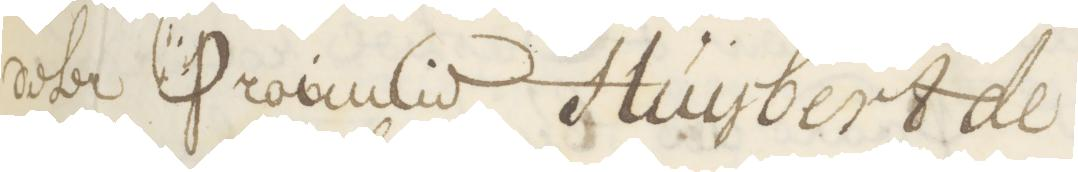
deler Provintie Huijbert de
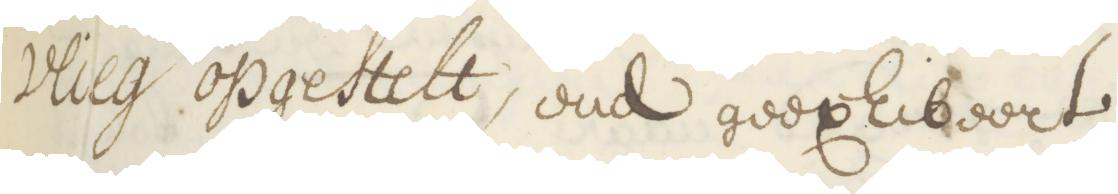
Vlieg opgestelt, ende geexhibeert
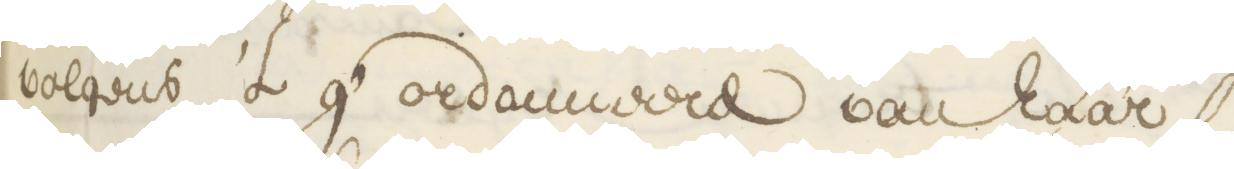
volgens ’t g’ordonneerd van haar
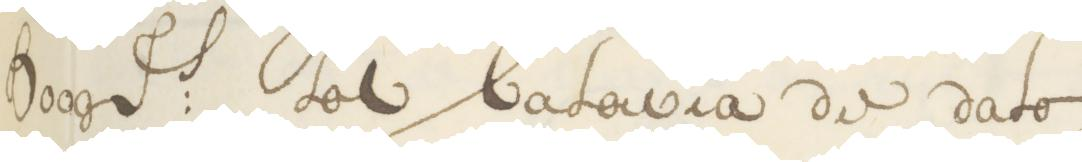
Hoog E:s tot batavia de dato
